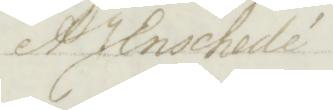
A J Enschedé
